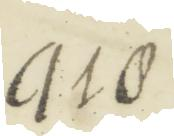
418
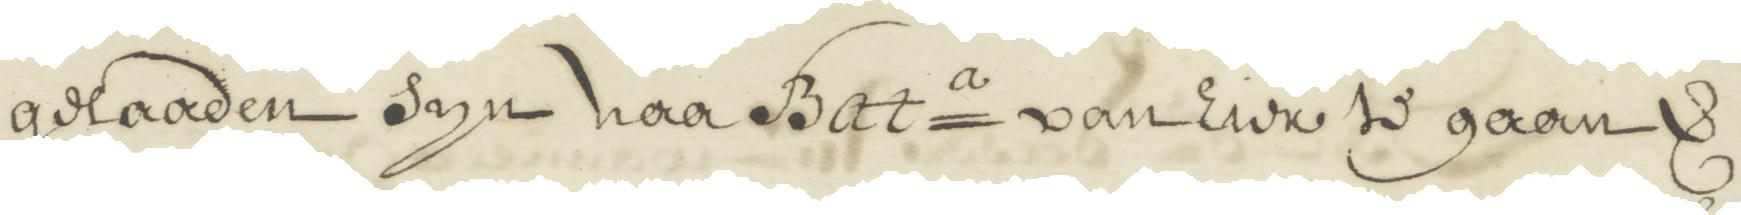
gelaaden syn naa Bat=a van hier te gaan ver
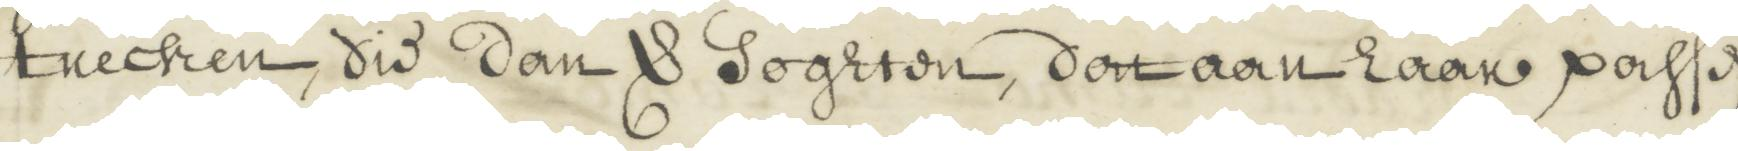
trecken, die dan versoghten, dat aan haar passen
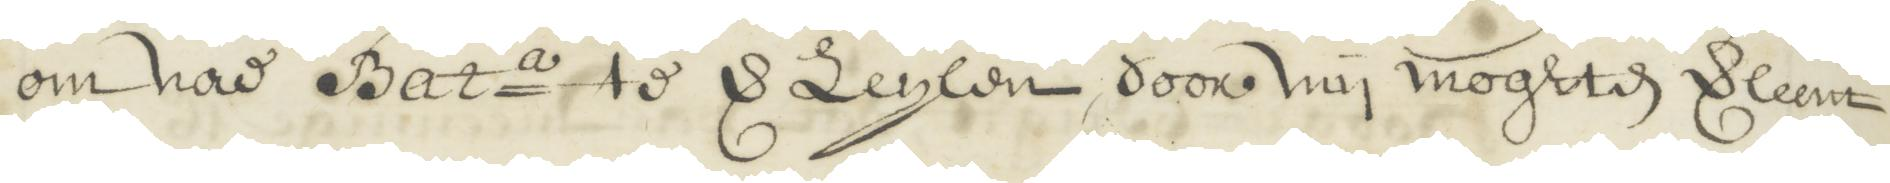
om nae Bat=a te verzeylen, door mij moghten verleent
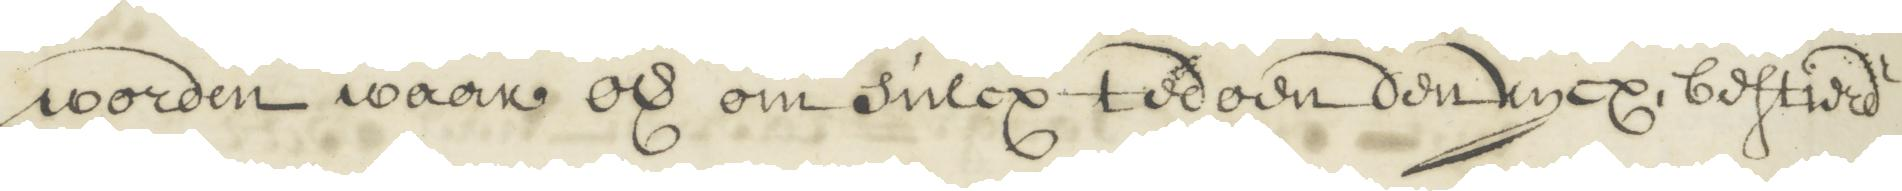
worden waar over om sulcx tedoen den rycx, bestierdr
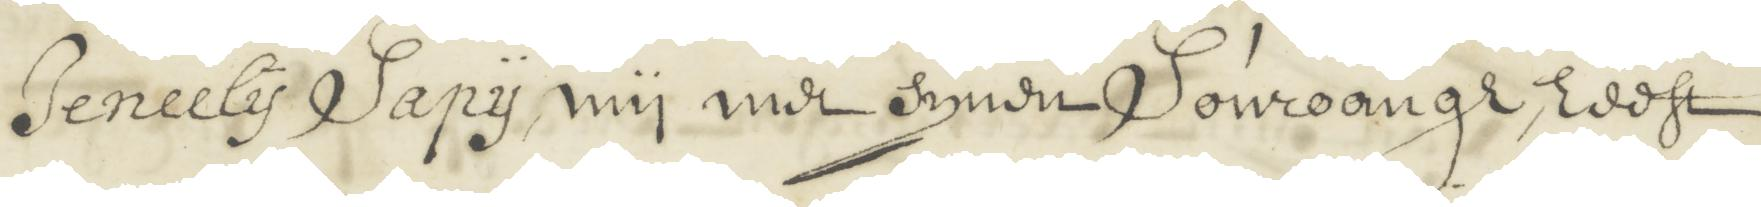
Ieneelij Sapij, mij met synen Souroangh, heeft
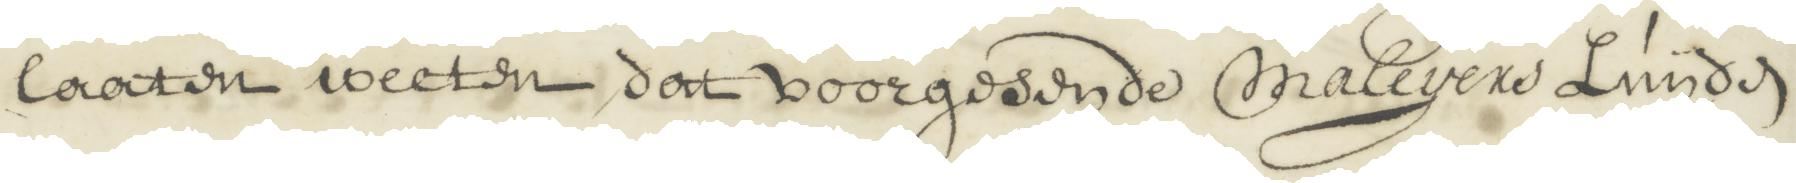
laaten weeten, dat voorgeseyde maleijers Luijden
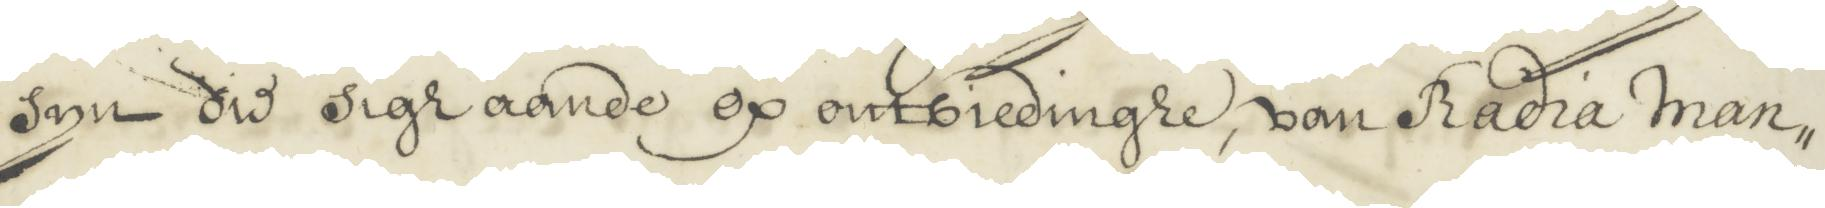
syn die sigh aande op ontbiedinghe, van Radia man„
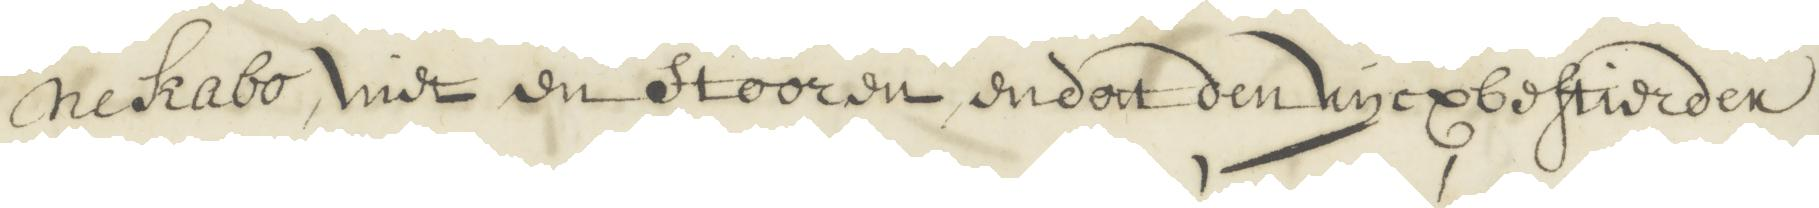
nekabo, niet en stooren, en dat den rijcxbestierder
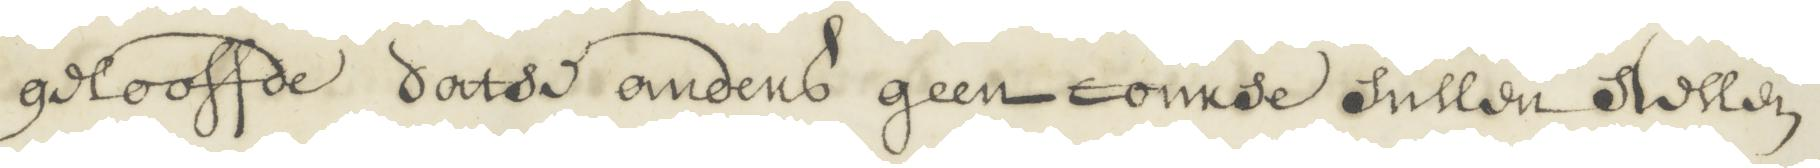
gelooffde datse anders geen course sullen stellen
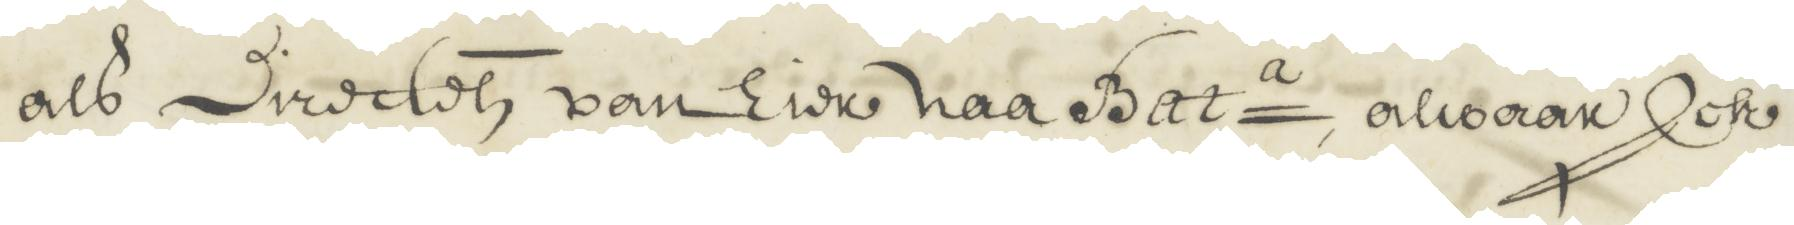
als directelijk van hier naa Bat=a, alwaar jck
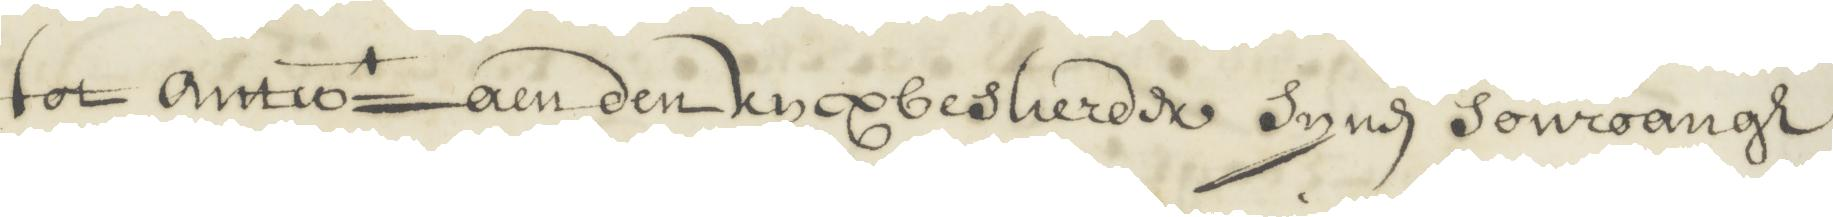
tot antw=t aen den rycxbestierder synen souroangh
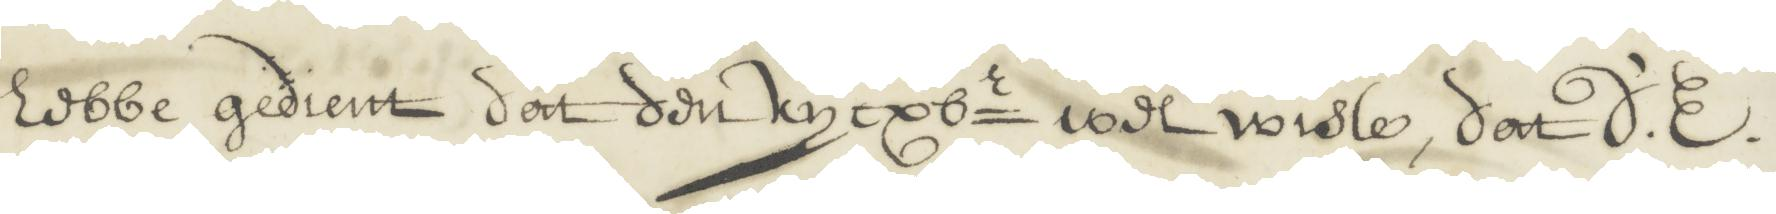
hebbe gedient dat den rycxb=r wel wiste, dat d.' E.
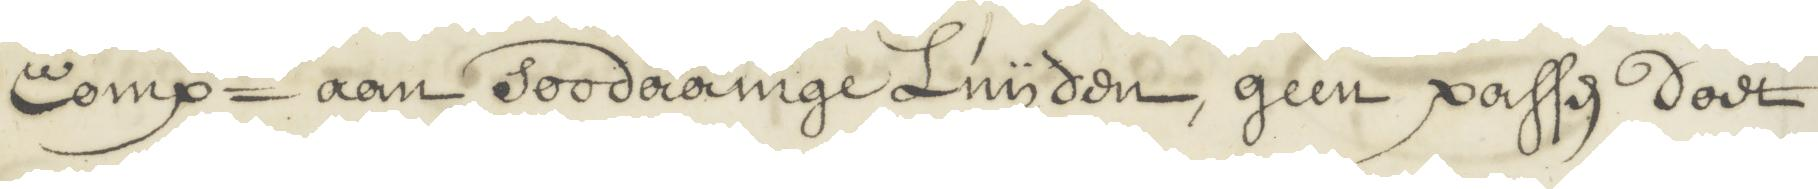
Comp=e aan soodaanige Luijden, geen passen doet
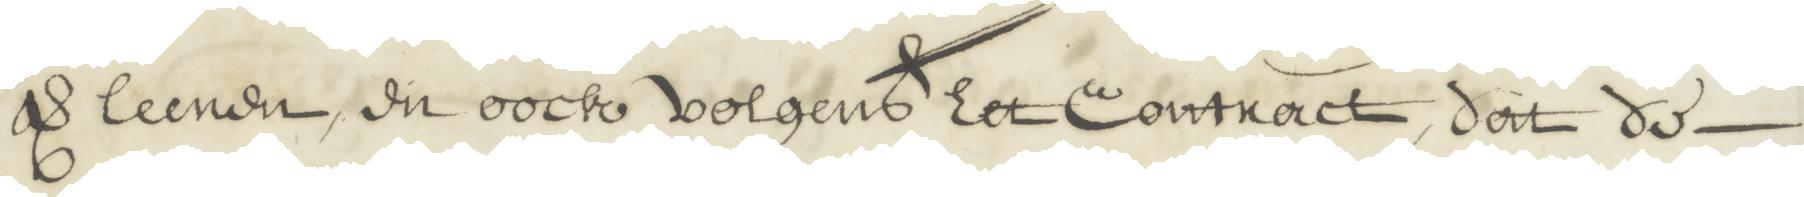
ver leenen, en oock volgens het Contract, dat de —
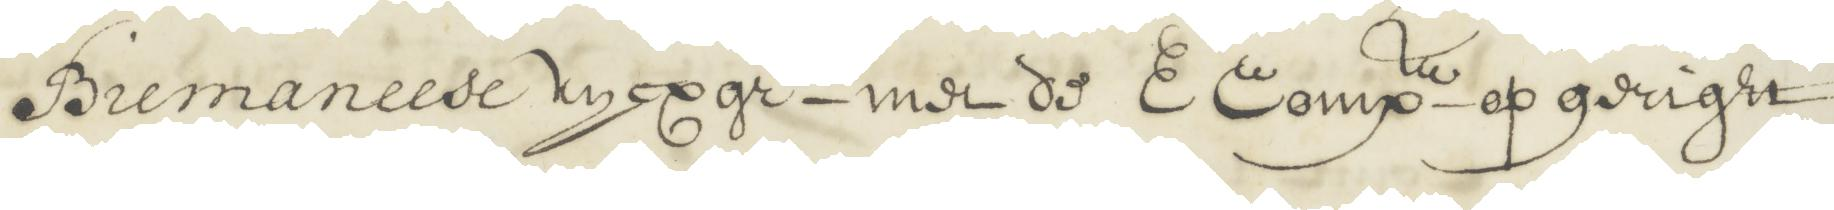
Biemaneese rycxgr-e met de E Comp=e op geright
